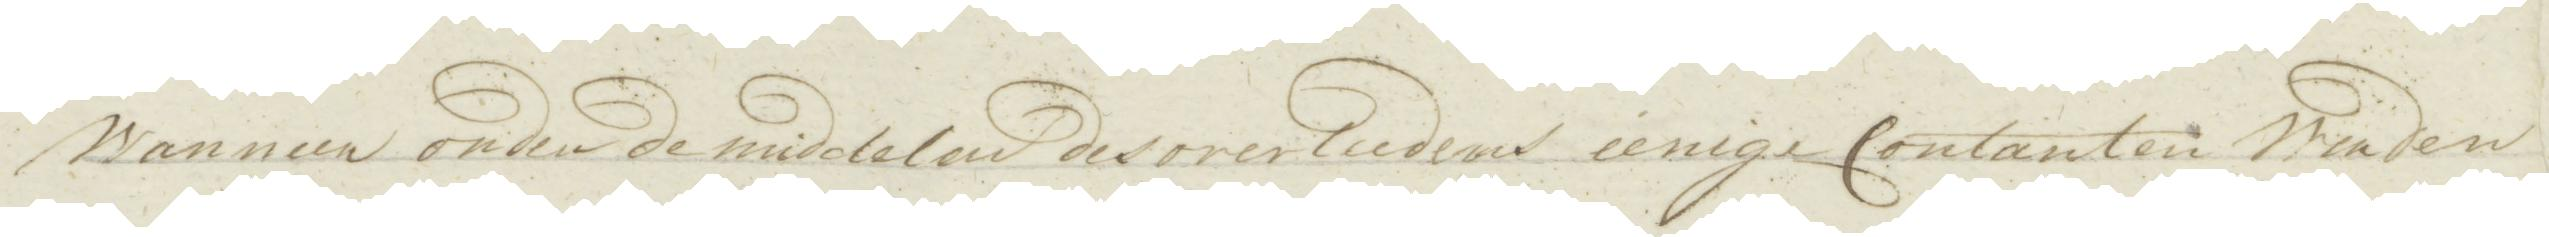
wanneer onder de middelen des overleedens eenige contanten werden
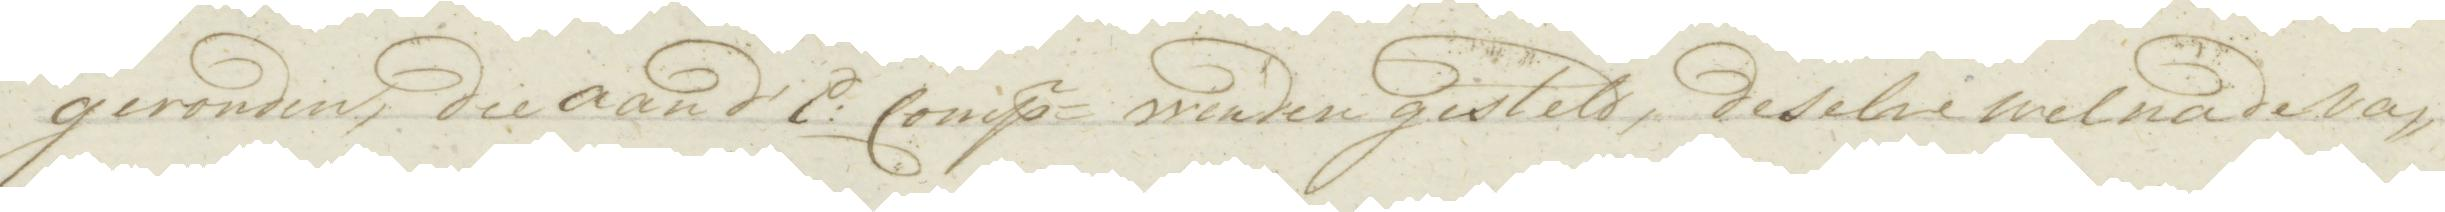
gevonden, die aan d’ E: Comp= werden gesteld, deselve wel na de va„
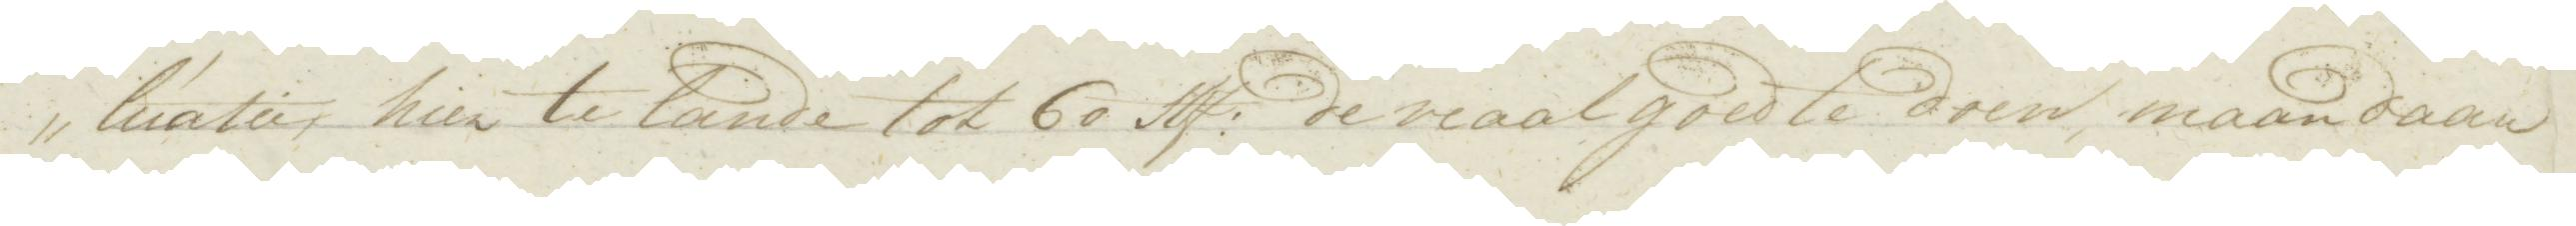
„luatie, hier te lande tot 60 stver: de reaal goed te doen, maar daar
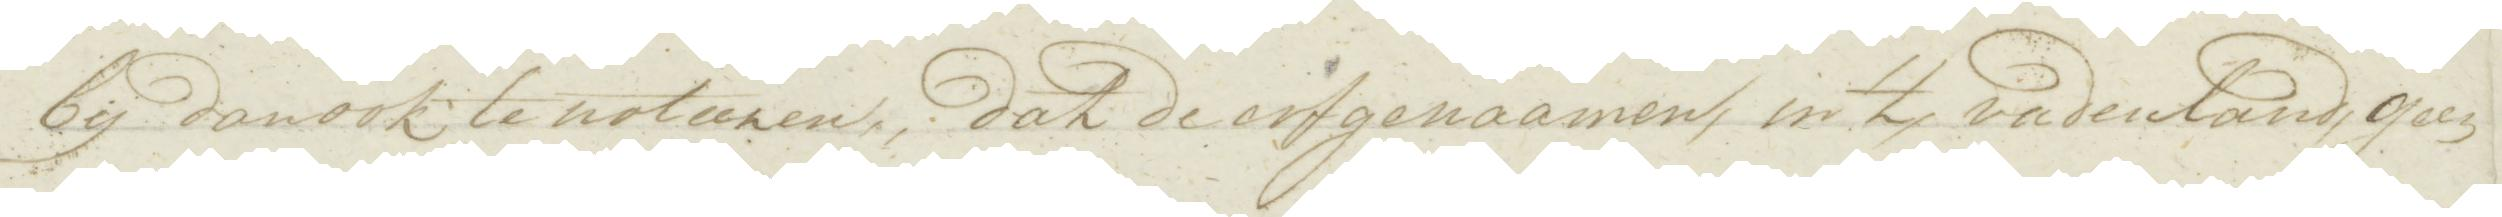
bij dan ook te noteeren, dat de erfgenaamen, in ’t vaderland, geen
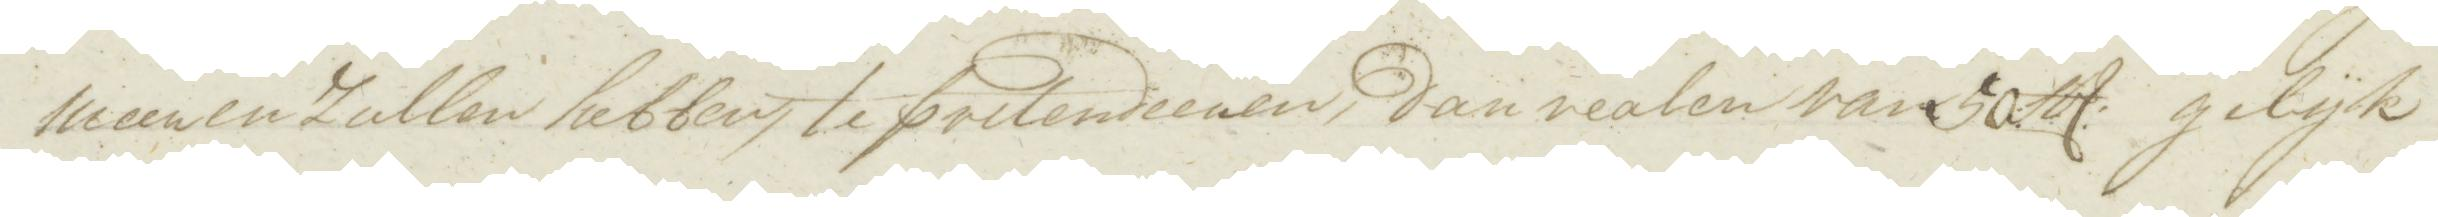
meer en zullen hebben, te pretendeeren, dan realen van 50 stver: gelijk
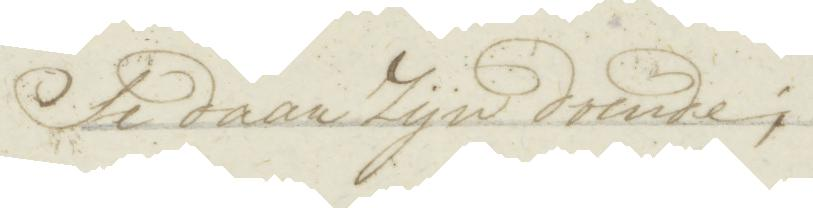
se daar zijn doende;
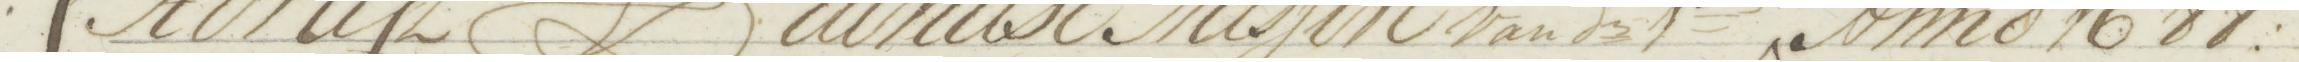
Extract Patriase Missive van d=n 1=sten ^ Anno 1688:
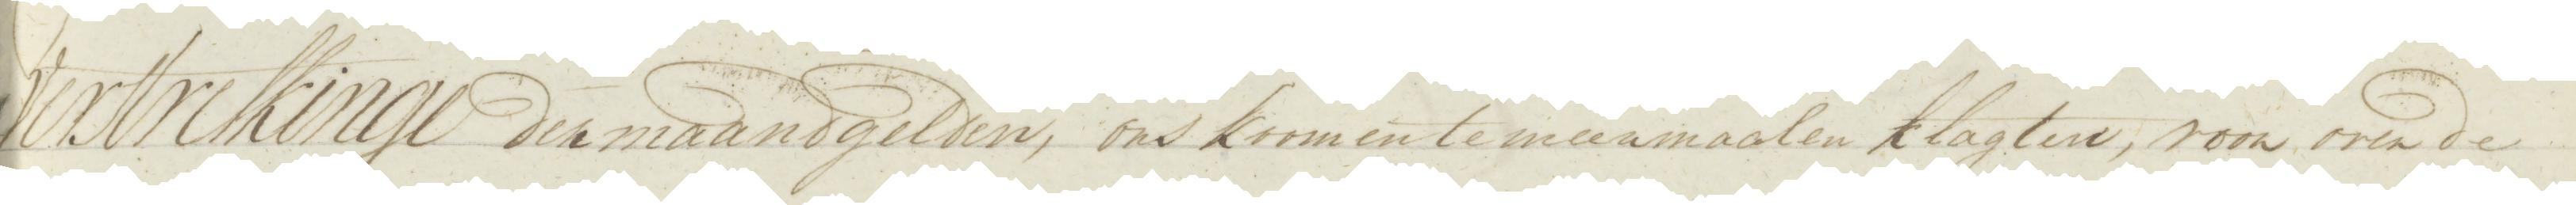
Verstrekkinge der maandgelden, ons koomen te meermaalen klagten, voor over de
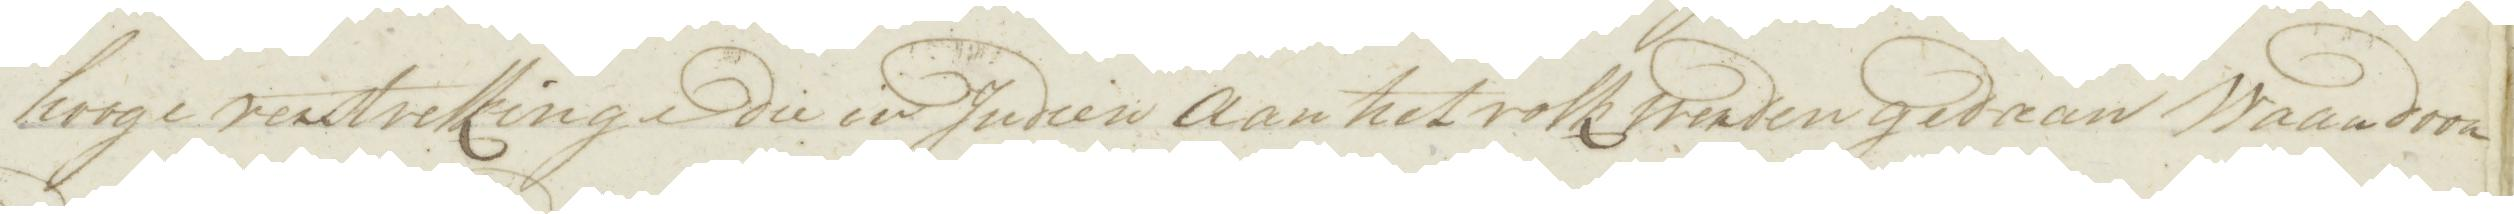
hooge verstrekinge die in Jndien aan het volk werden gedaan waar door
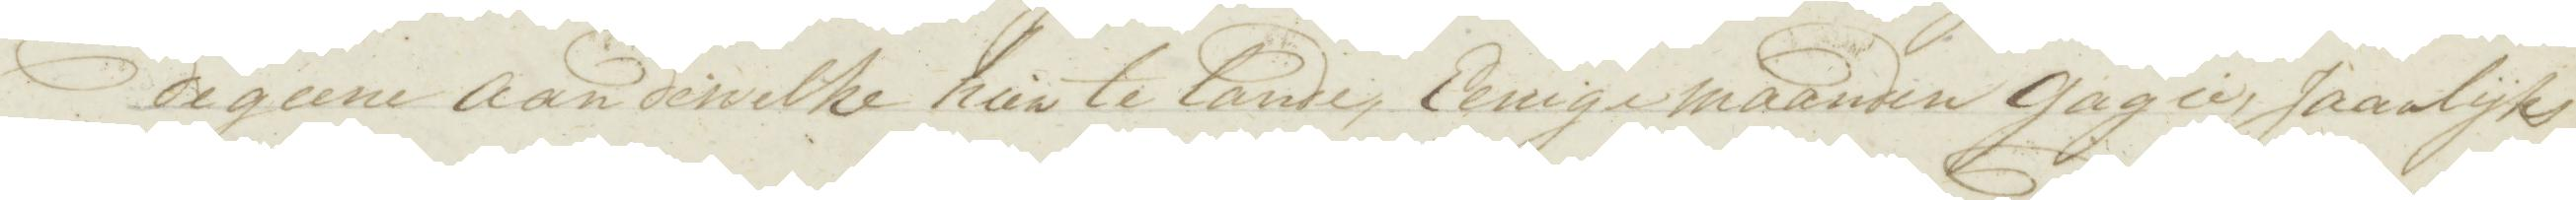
de geene aan dewelke hier te lande, Eenige maanden gagie, Jaarlijks
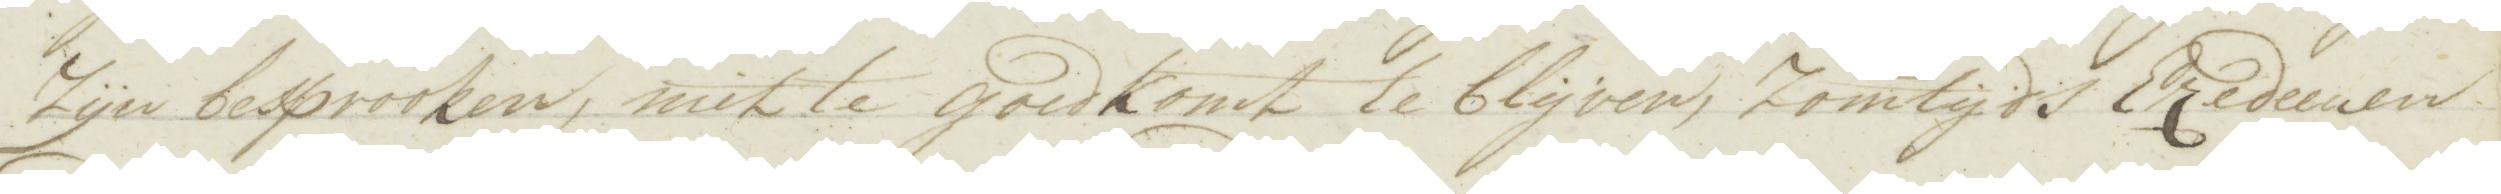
zijn besprooken, niet te goed komt te blijven, zomtijds Eredeeren
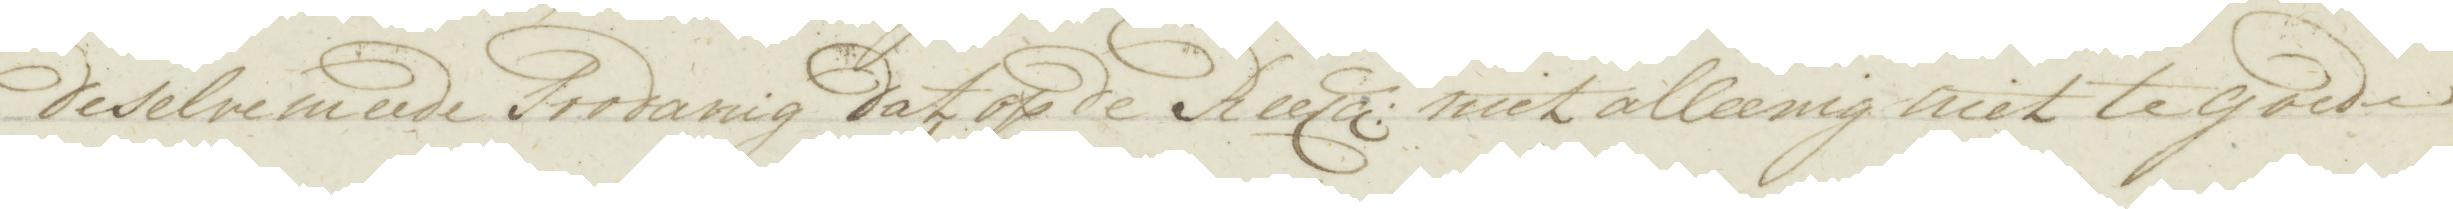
deselve meede soodanig dat op de Reecq: niet alleenig niet te goede
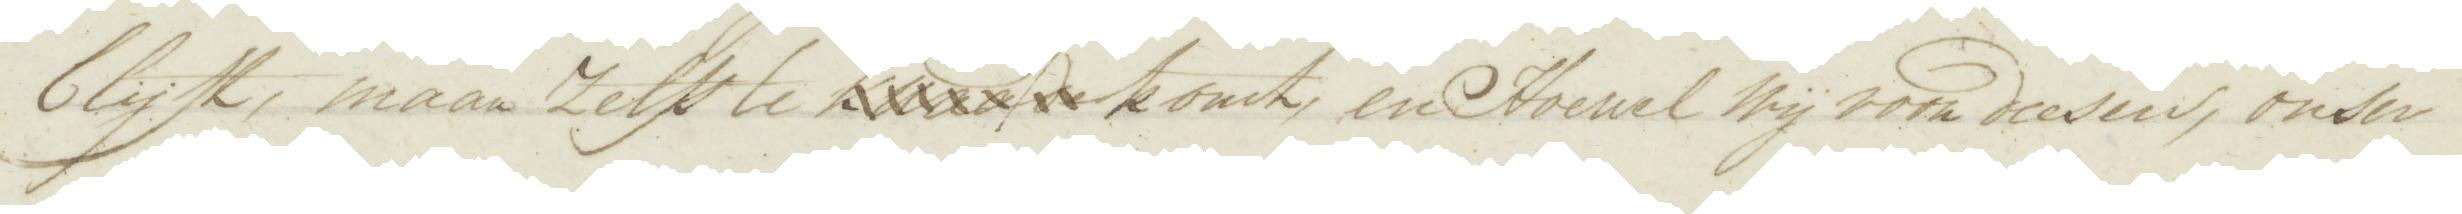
blijft, maar zelfs te kwaad kort komt, en Hoewel wij voor deesen, onser
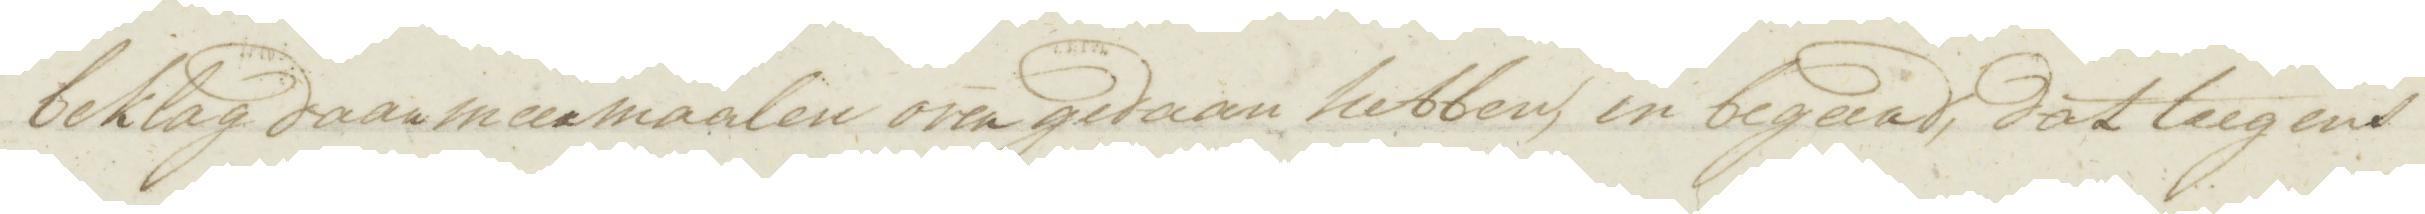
beklag daar meermaalen over gedaan hebben, en begeerd, dat teegens
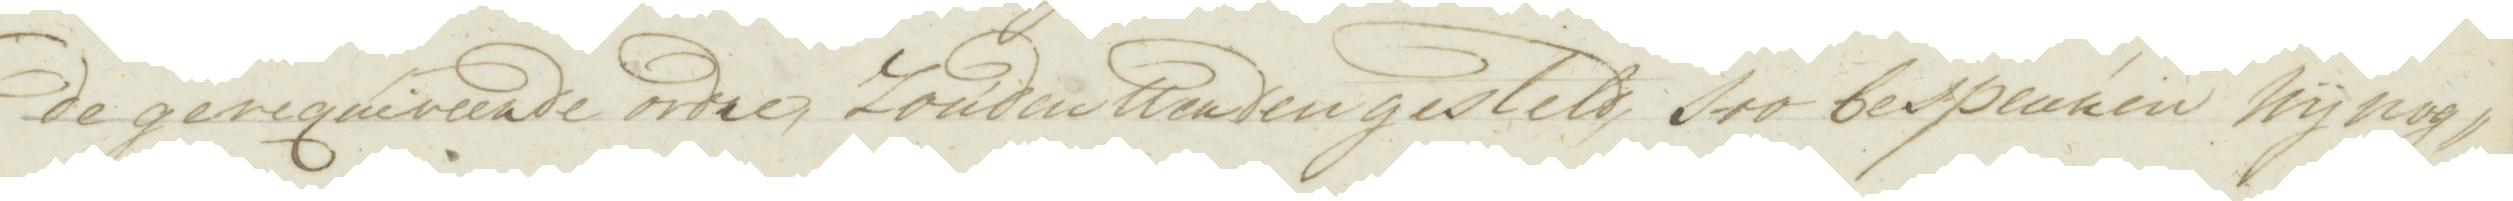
de gerequireerde ordre, zouden werden gesteld, soo bespeuren wij nog„
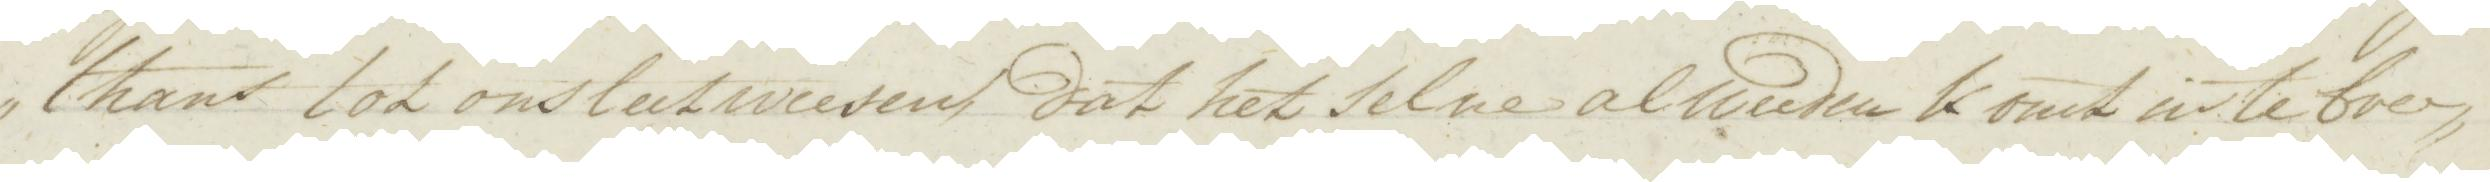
„thans tot ons leetweesen, dat het selve alweeder komt in te boe„
